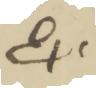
Etc
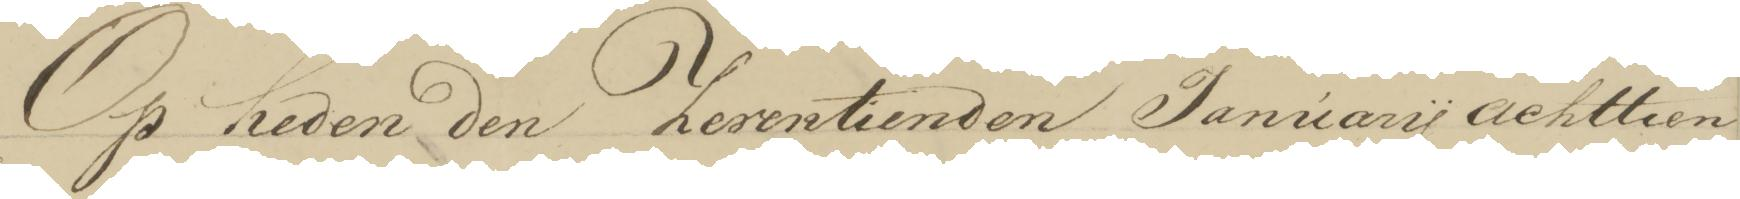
Op heden den Zeventienden Ianuarij achttien
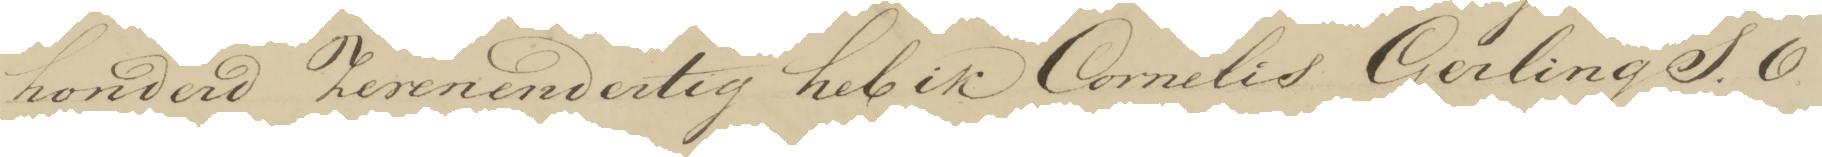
honderd Zevenendertig heb ik Cornelis Gerlings. O.
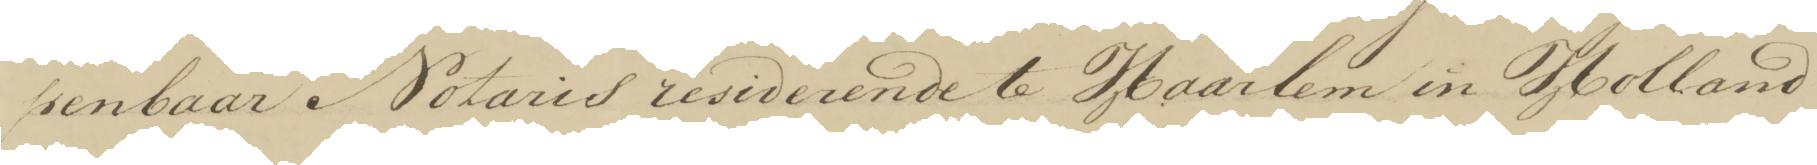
penbaar Notaris residerende te Haarlem in Holland
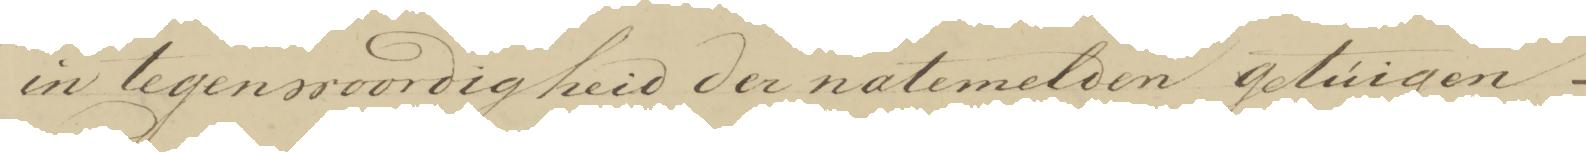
in tegenwoordigheid der natemelden getuigen
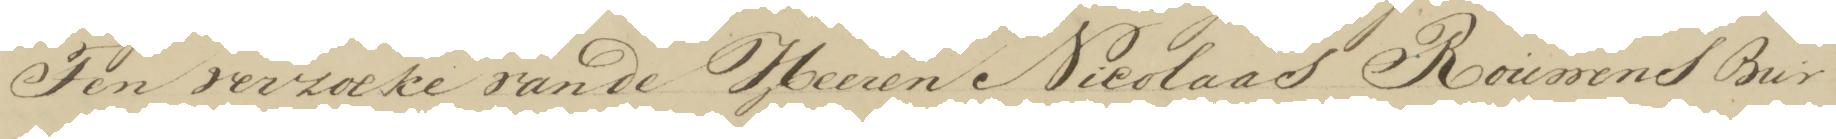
Ten verzoeke van de Heeren Nicolaas Rouwens Bur
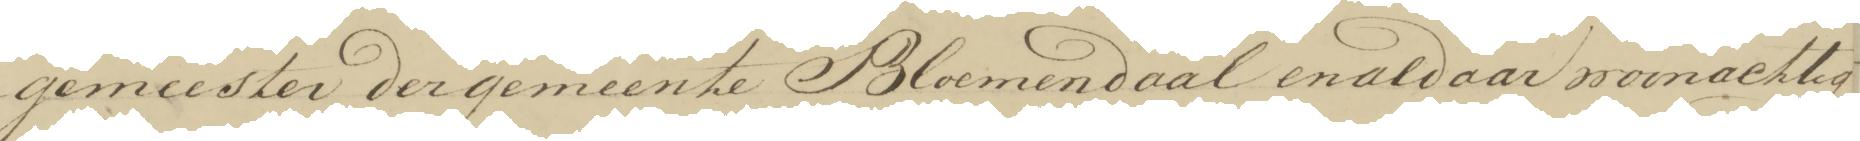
gemeester der gemeente Bloemendaal en aldaar woonachtig
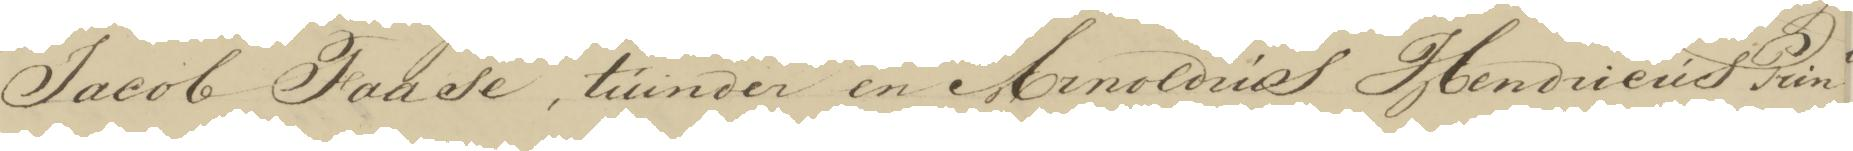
Iacob Faase, tuinder en Arnoldus Hendricus Prin
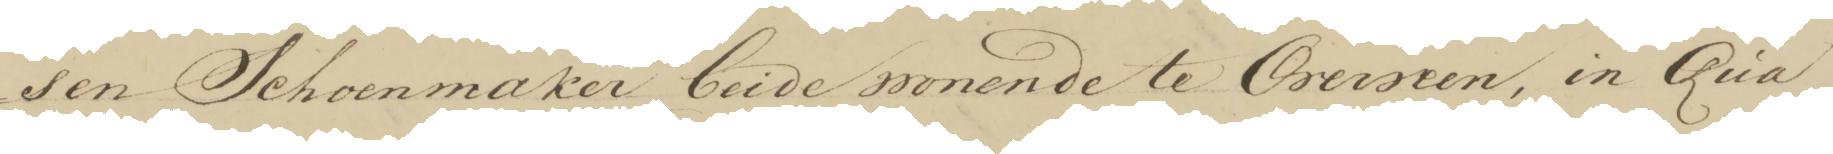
sen Schoenmaker beide wonende te Overveen, in Qua
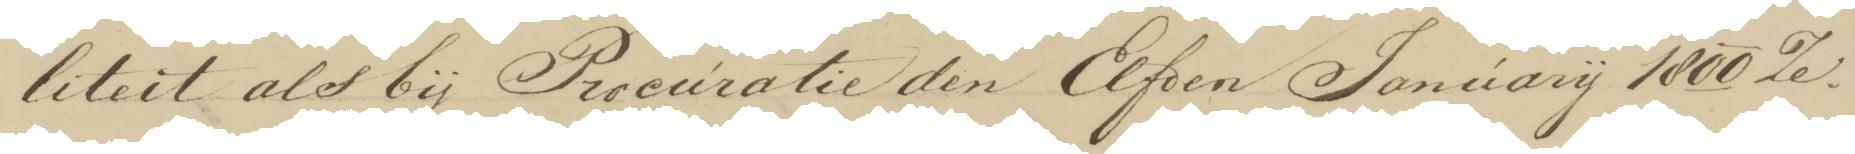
liteit als bij Procuratie den Elfden Ianuarij 1800 Ze,
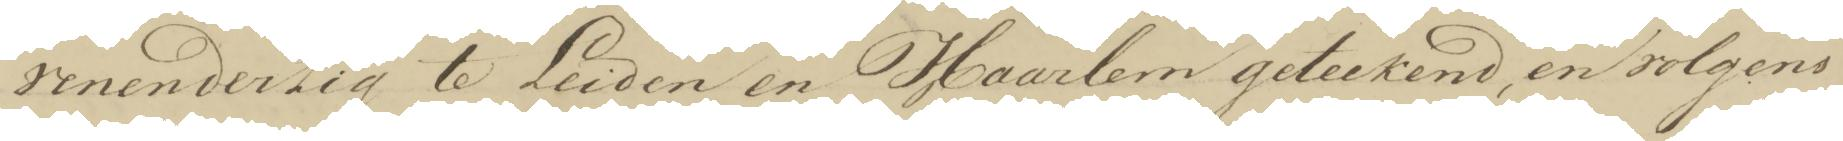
venendertig te Leiden en Haarlem geteekend, en volgens
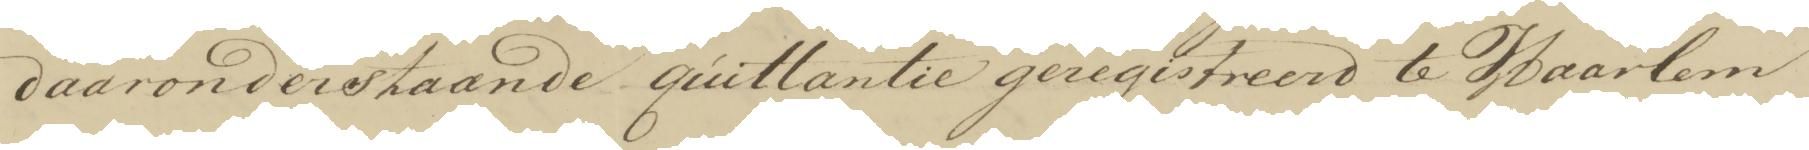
daaronderstaande quittantie geregistreerd te Haarlem
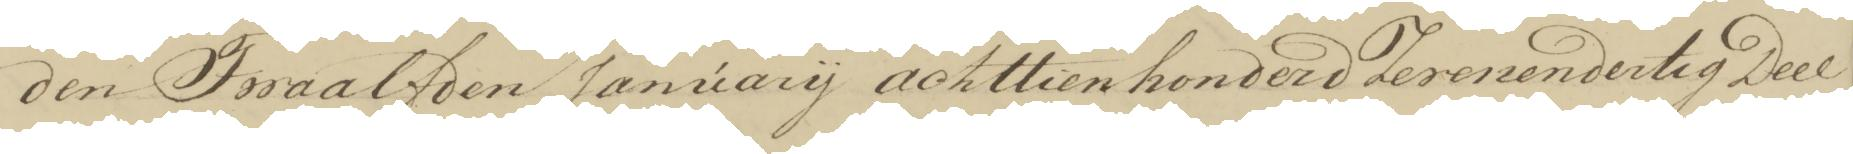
den Twaalfden Januarij achttien honderd Zevenendertig Deel
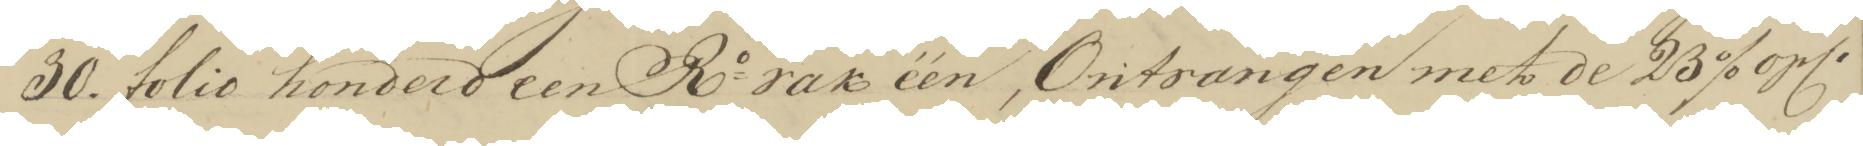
30. folio honderd een R=o vak één, Ontvangen met de 23% opc'
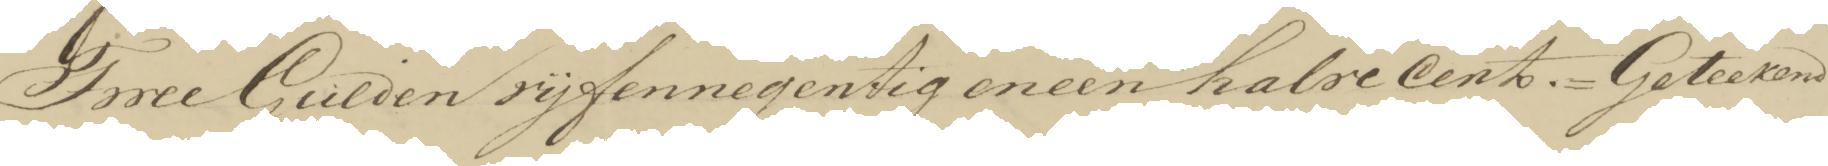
Twee Gulden vijfennegentig en een halve cent.=Geteekend
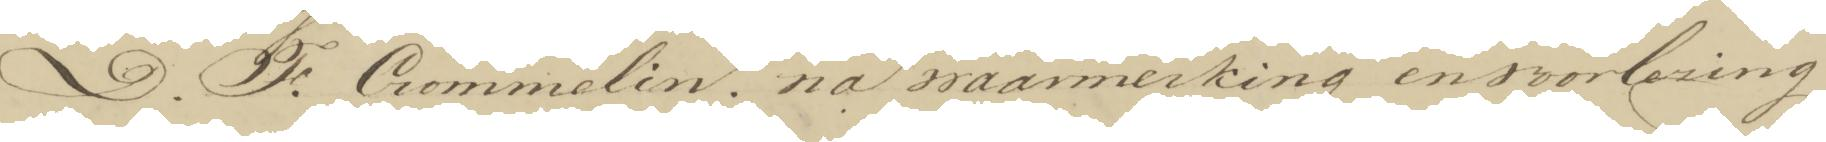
D.F. Crommelin. na waarmerking en voorlezing
